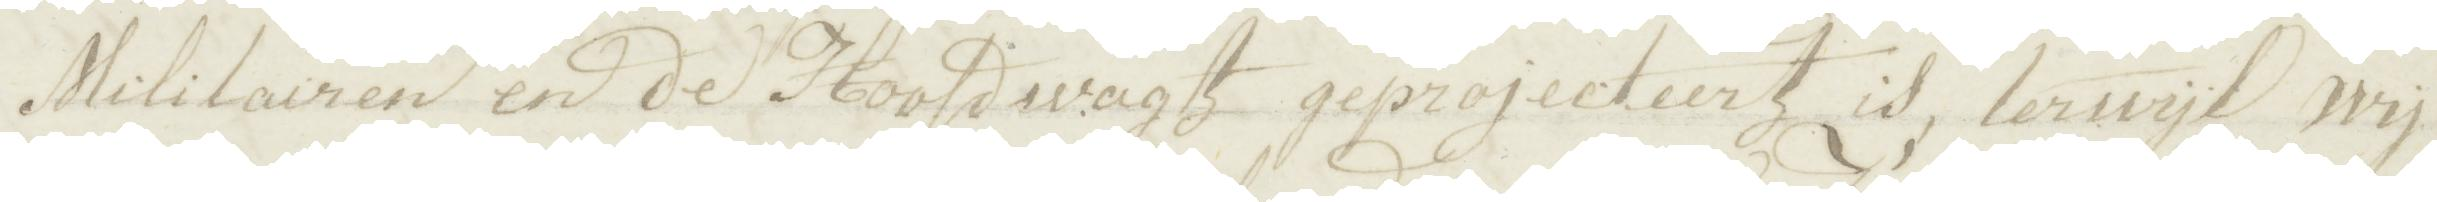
Militairen en de Hoofdwagt geprojecteert is, terwijl wij
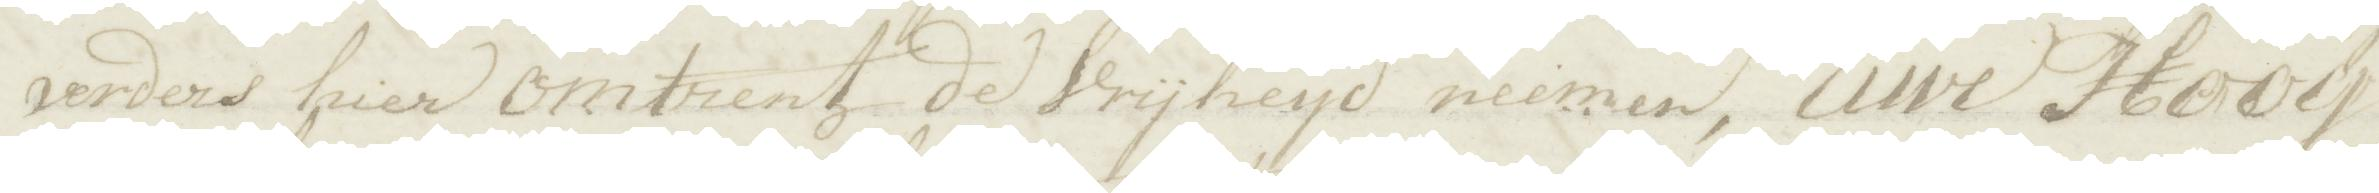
verders hier omtrent de vrijheijd neemen, Uwe Hoog
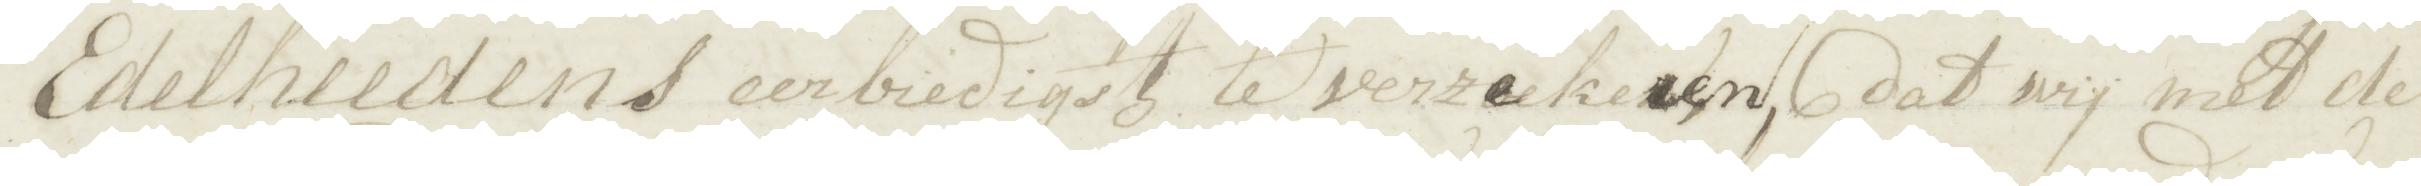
Edelheedens eerbiedigst te verzeekeren, dat wij met de
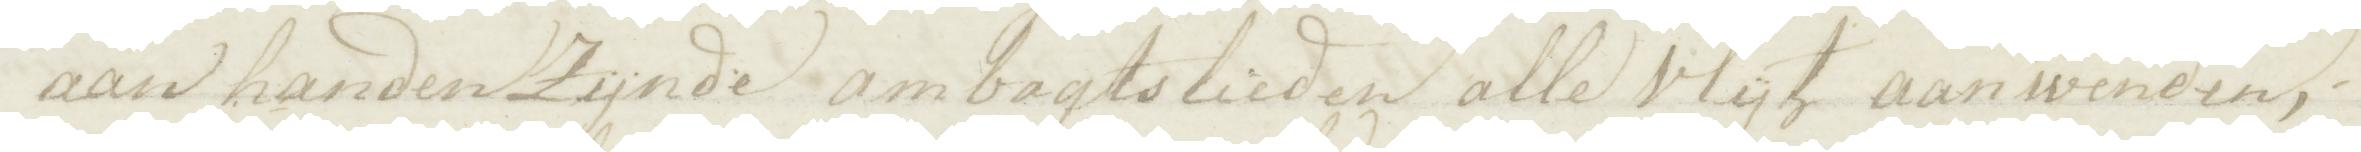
aan handen Zijnde ambagtslieden alle vlijt aanwenden, -
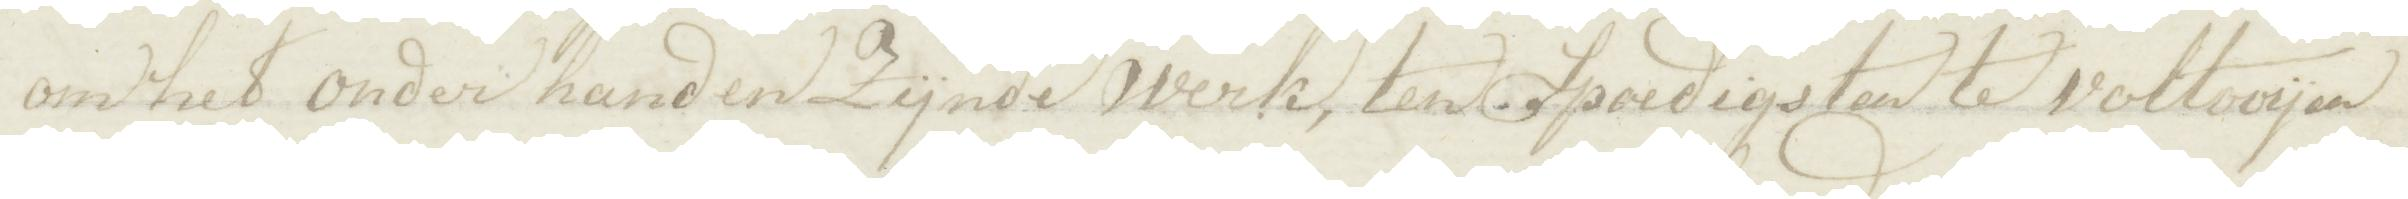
om het onder handen Zijnde werk, ten Spoedigsten te voltooijen
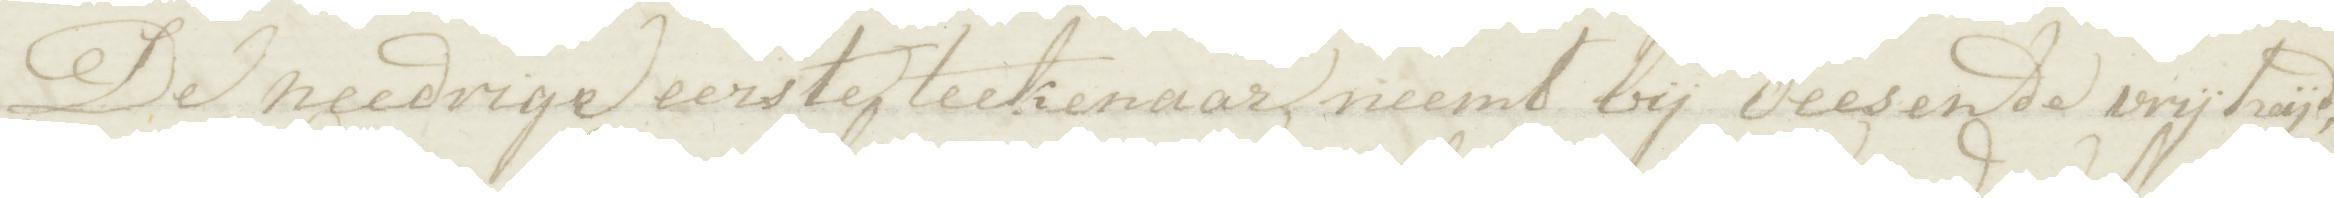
De needrige eerste teekenaar neemt bij deesen de vrijheijd,
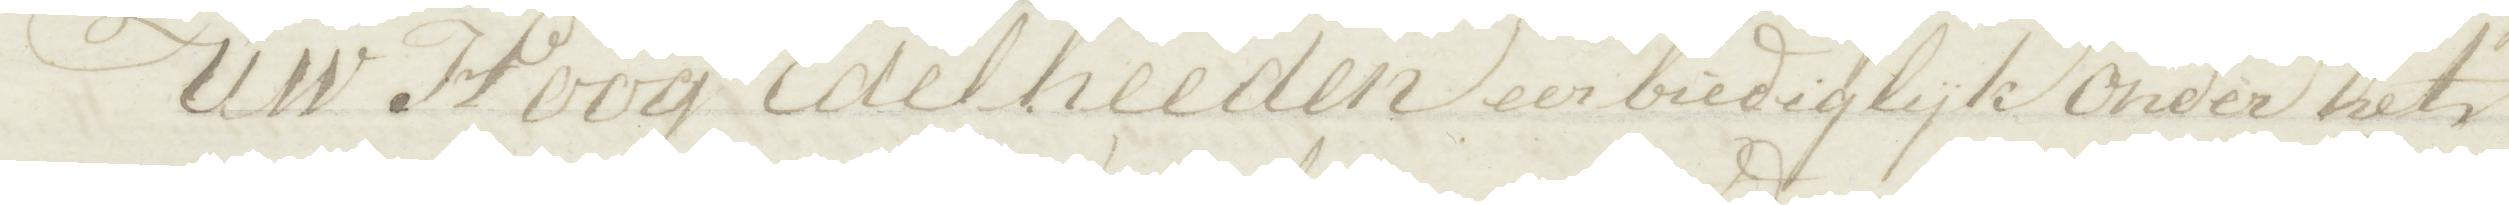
UW Hoog Edelheeden eerbiediglijk onder het
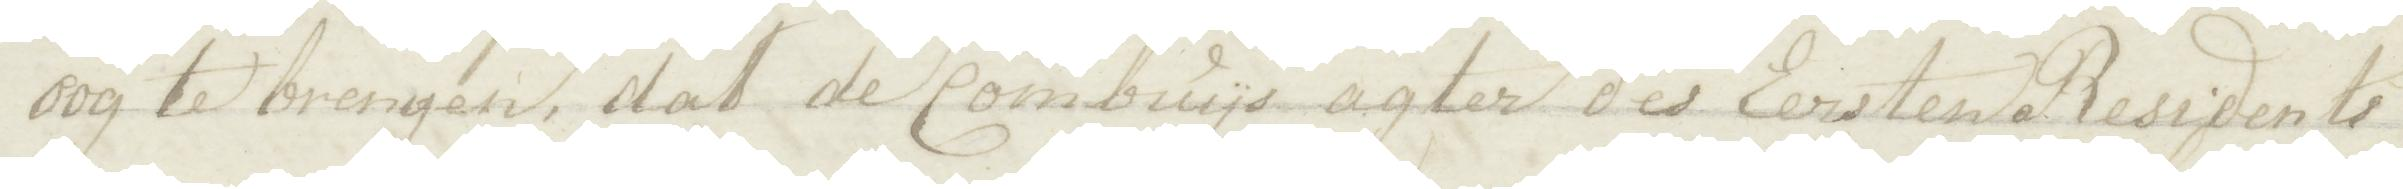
oog te brengen, dat de Combuijs agter des Eersten Resident
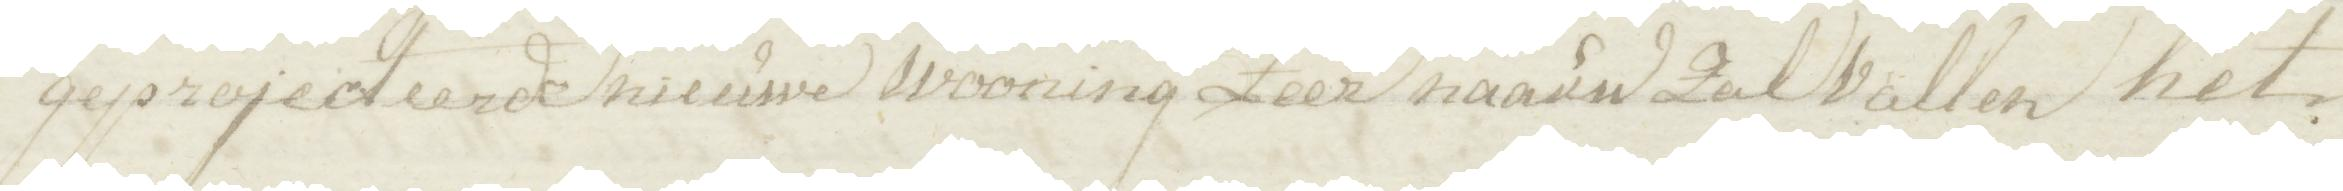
geprojecteerde nieuwe wooning Zeer naauw Zal vallen het.
